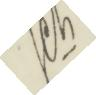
Sch
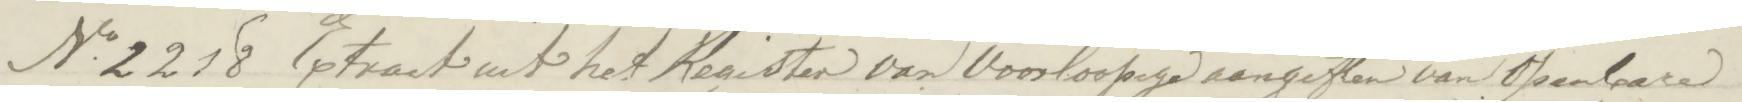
N.o 2218 Extract uit het Register van voorloopige aangiften van Openbare
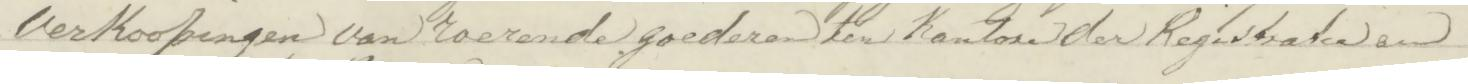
Verkoopingen van roerende goederen ten kantore der Registratie en
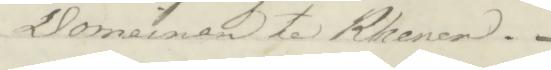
Domeinen te Rhenen. -
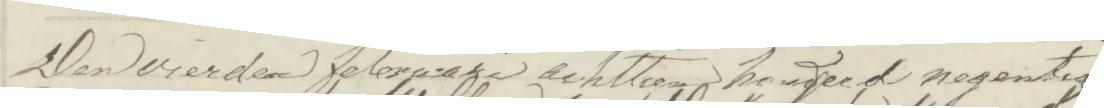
Den vierden februari achttien honderd negentig
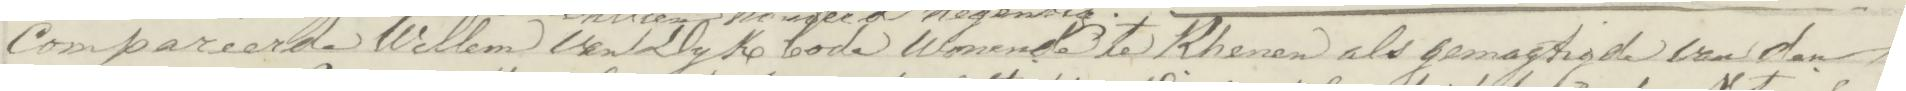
compareerde Willem van Dijk bode wonende te Rhenen als gemagtigde van den
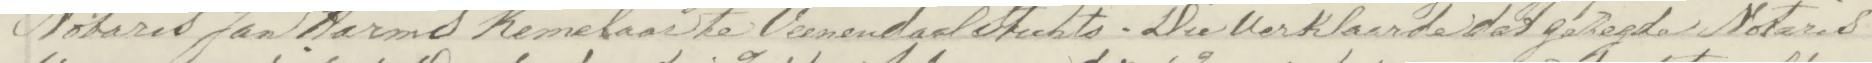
Notaris Jan Harms Kemelaar te Veenendaal Stichts - Die verklaarde dat gezegde Notaris
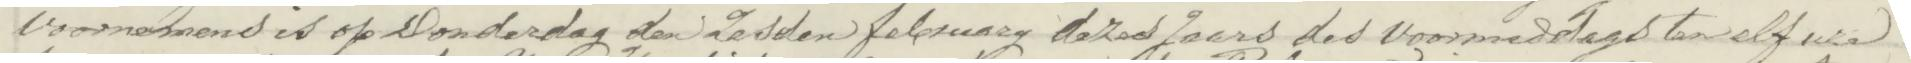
voornemens is op Donderdag den Zesden february dezes Jaars des voormiddags ten elf ure
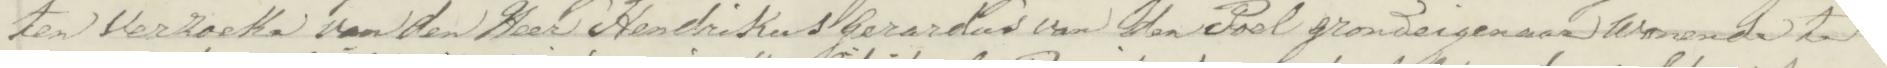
ten verzoeke van den Heer Hendrikus Gerardus van den Poel grondeigenaar wonende te
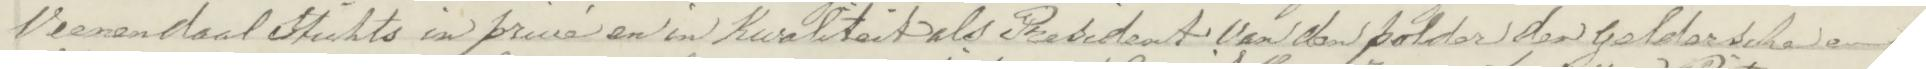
Veenendaal stichts in privé en in kwaliteit als President van den polder der Geldersche en
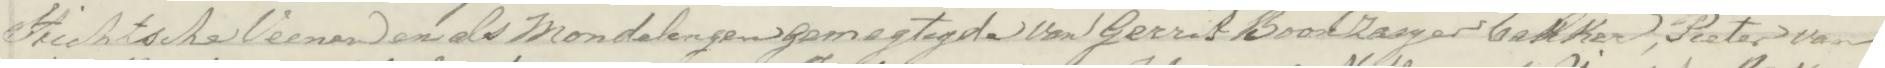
Stichtsche Veenen en als Mondelingen gemagtigde van Gerrit Boonzayer bakker, Pieter van
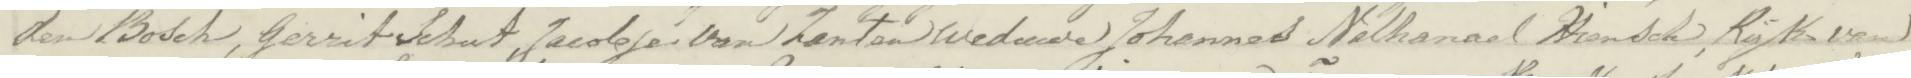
den Bosch, Gerrit Schut, Jacobje van Zanten weduwe Johannes Nathanael Hiensch, Rijk van
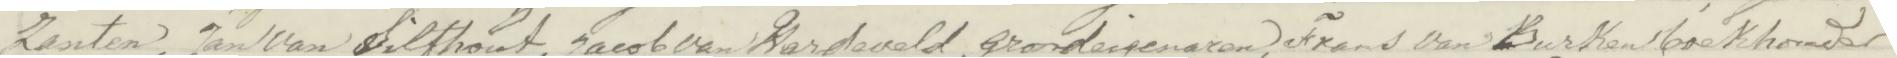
Zanten, Jan van Silfhout, Jacob van Hardeveld, Grondeigenaren, Frans van Burken boekhouder
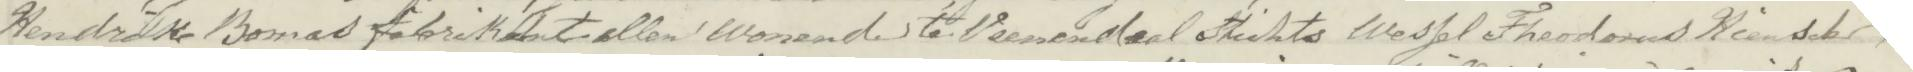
Hendrik Bomas fabrikant allen wonende te Veenendaal Stichts Wessel Theodorus Hiensch
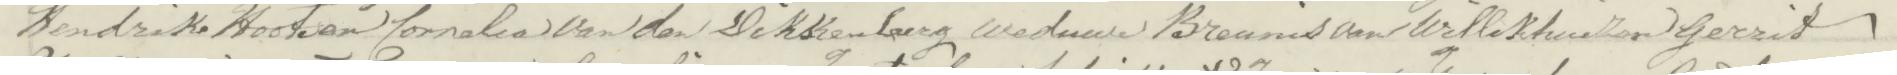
Hendrik Hootsen Cornelia van den Dikkenberg weduwe Breunis van Willikhuizen Gerrit
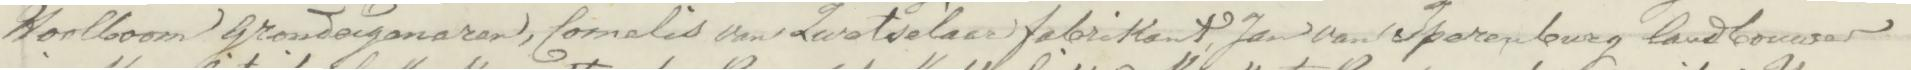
Hoolboom Grondeigenaren, Cornelis van Zwetselaar fabrikant, Jan van Sperenburg landbouwer
